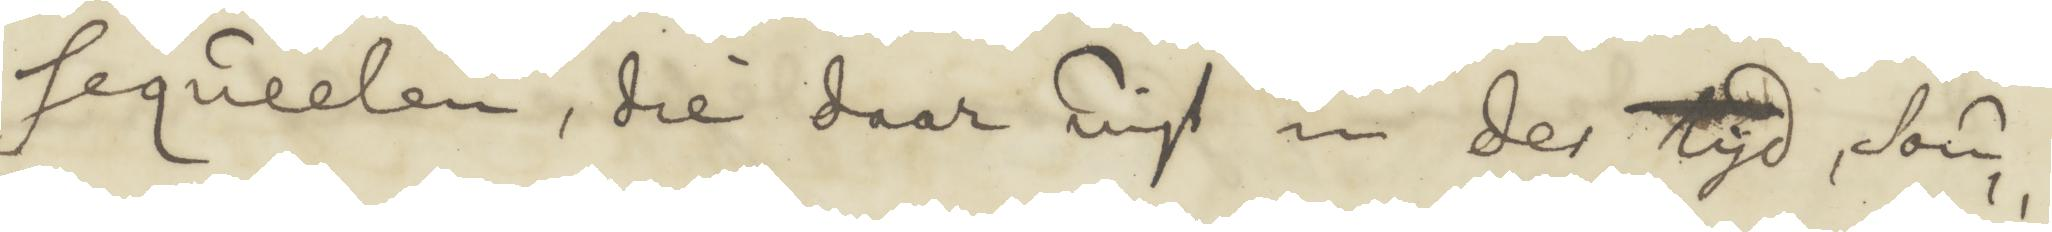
sequeelen, die daar uijt in der tijd, sou„
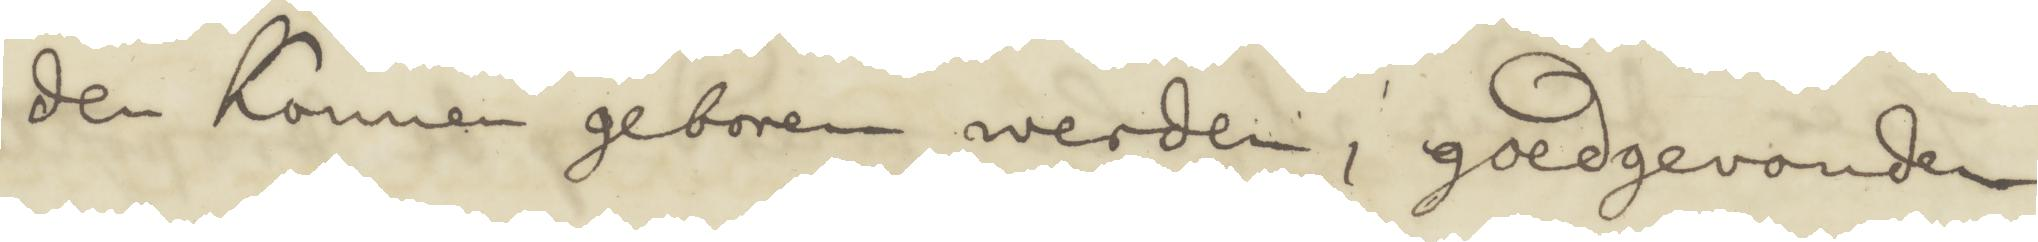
den konnen geboren werden, goedgevonden
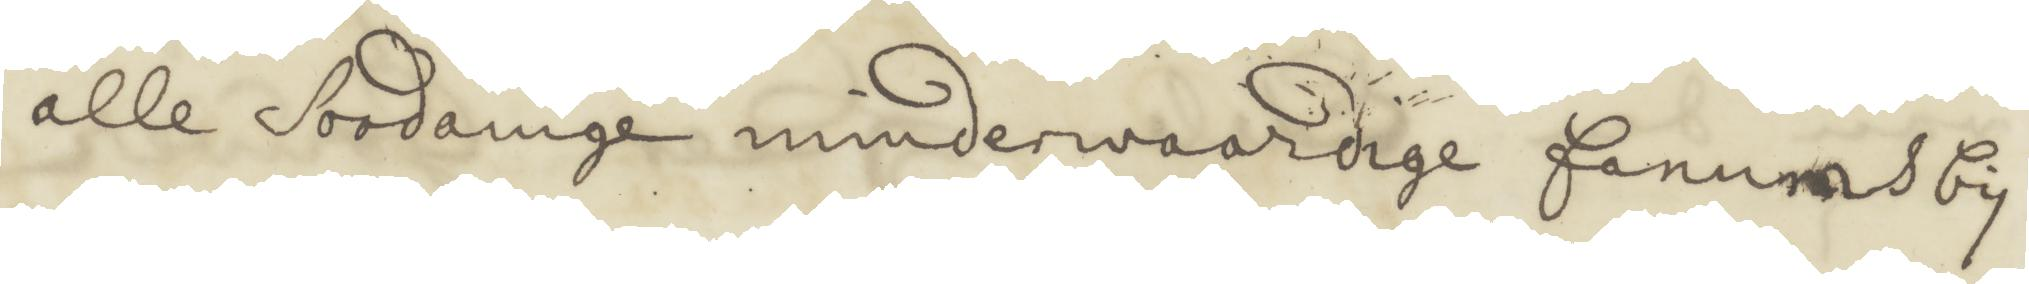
alle soodanige minderwaardige fanums bij
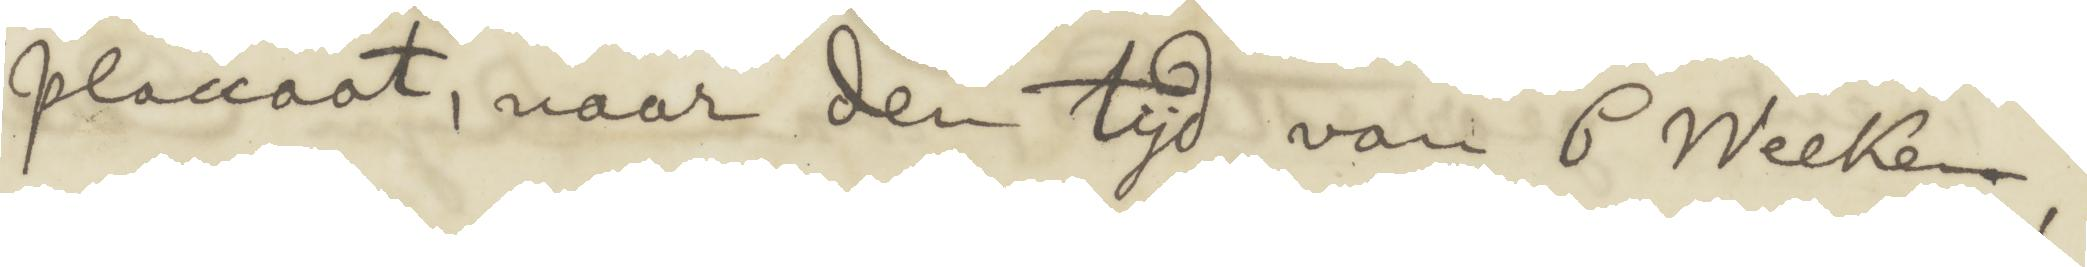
placcaat, naar den tijd van 6 weeken,
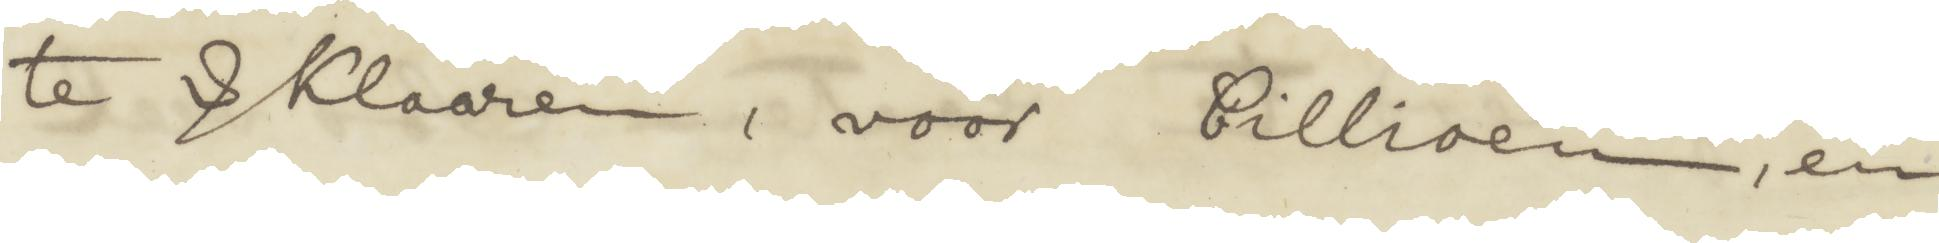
te verklaaren, voor billioen, en
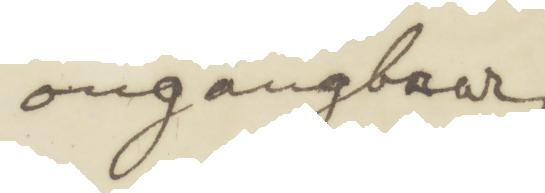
ongangbaar
